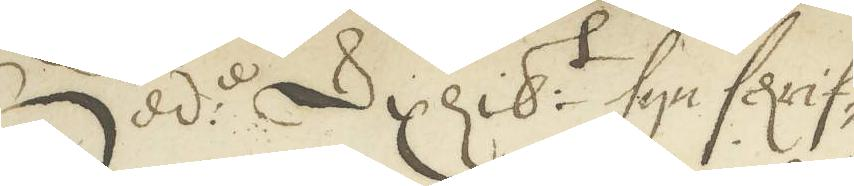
D Ged:e Exhib:t syn schrif=
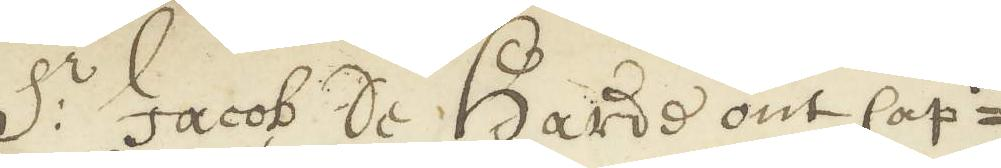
S:r Iacob de Harde out Cap=tn
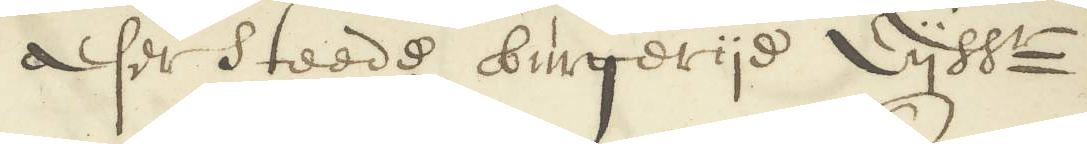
deser steede burgerije Eijss=r
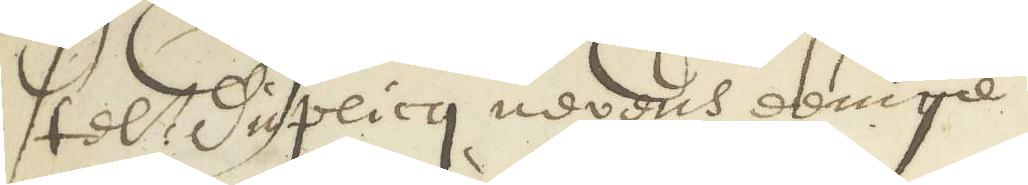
telijk duplicq nevens eenige
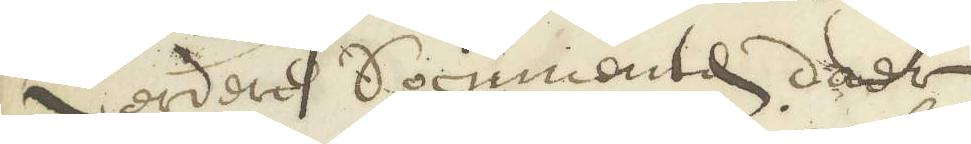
Eerdere documenten daer
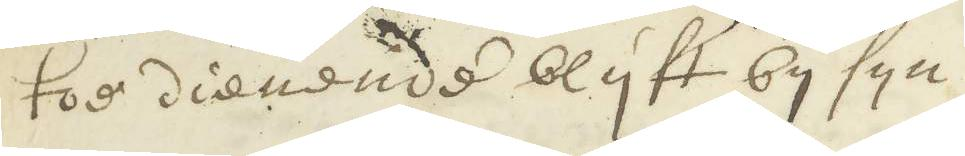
toe dienende blijft by syn
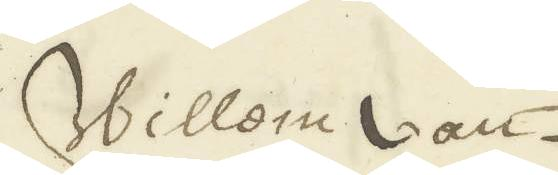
S:r Willem van Orten
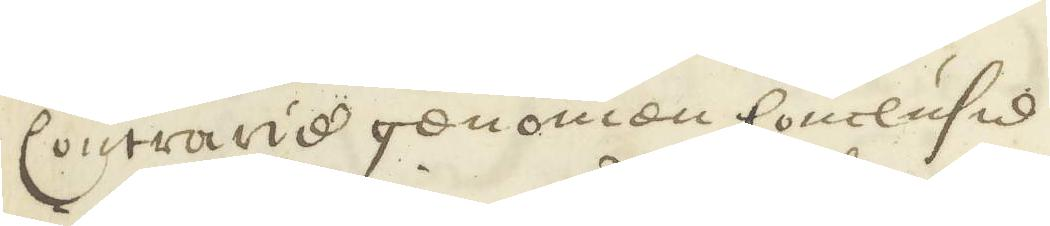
Contrarie genomen Conclusie
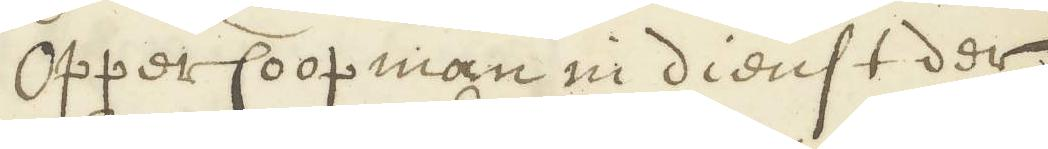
opper coopman in dienst der
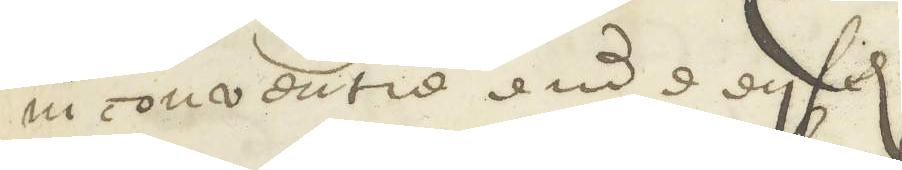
in conventie ende eysch
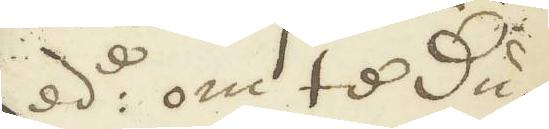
Ged:e om te Du
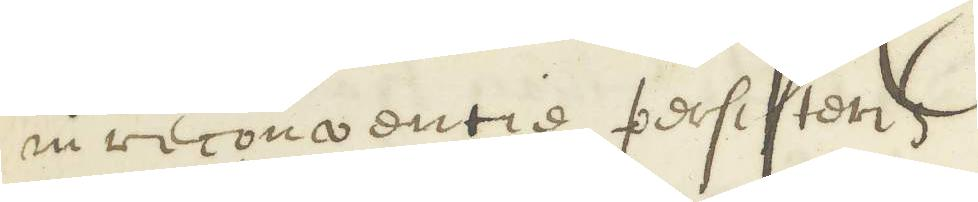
in reconventie persisteren
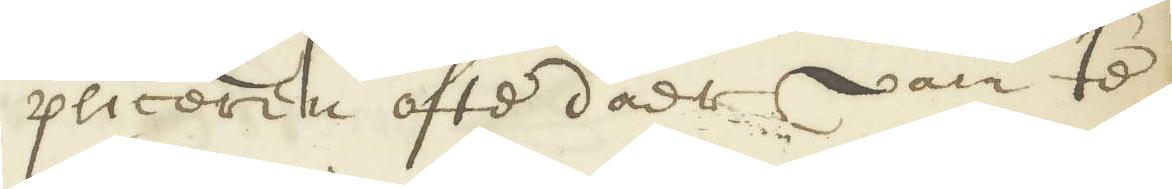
pliceren ofte daer van te
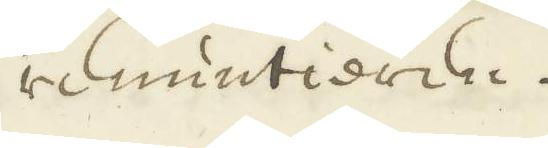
renuntieren
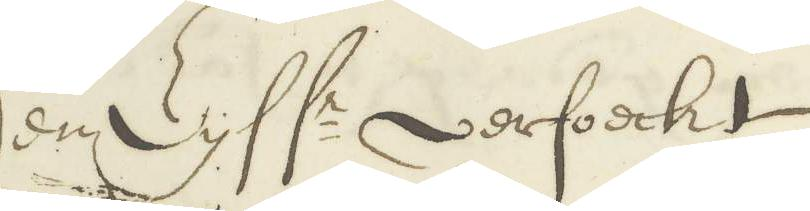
Den Eijss=r versoeckt
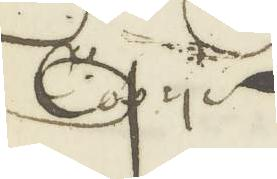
Copije
